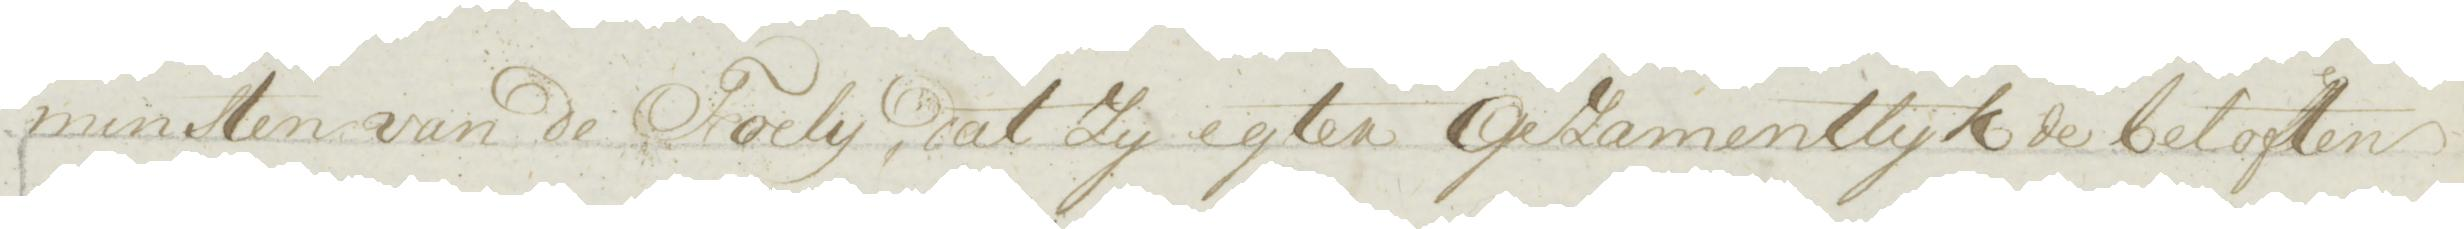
minsten van de Foelij, dat zij egter gezamentlijk de beloften
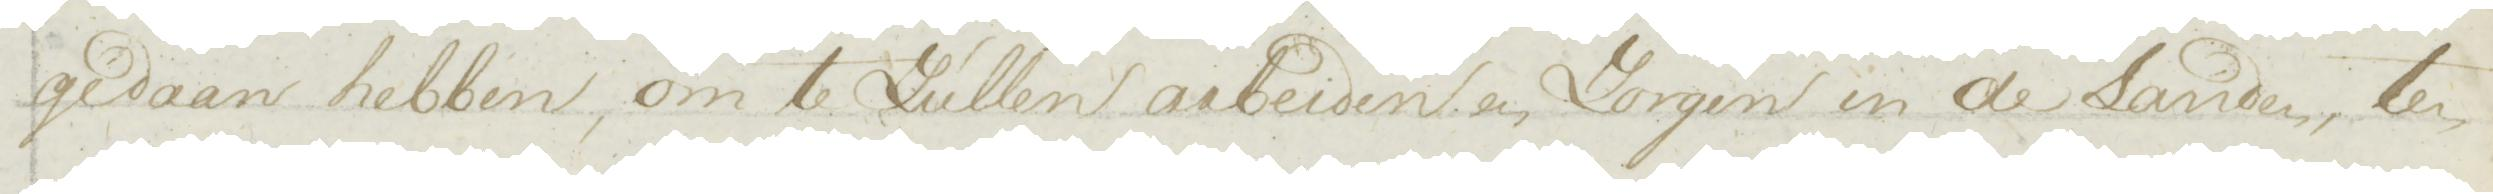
gedaan hebben, om te zullen arbeiden en zorgen in de Landen, ten
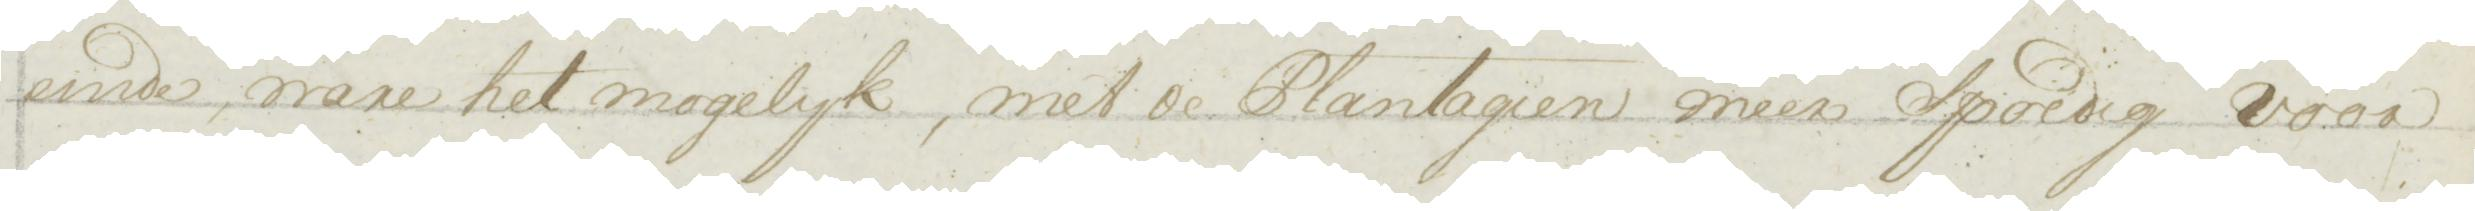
einde, ware het mogelyk, met de Plantagien meer spoedig voor
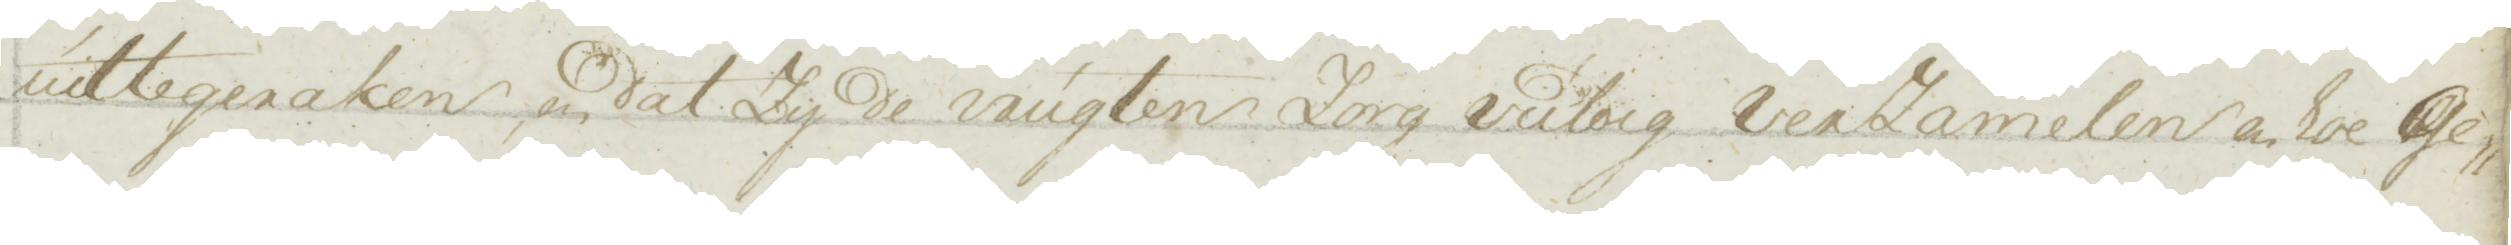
uittegeraken, en dat zij de vrugten zorg vuldig verzamelen en hoe Ge„
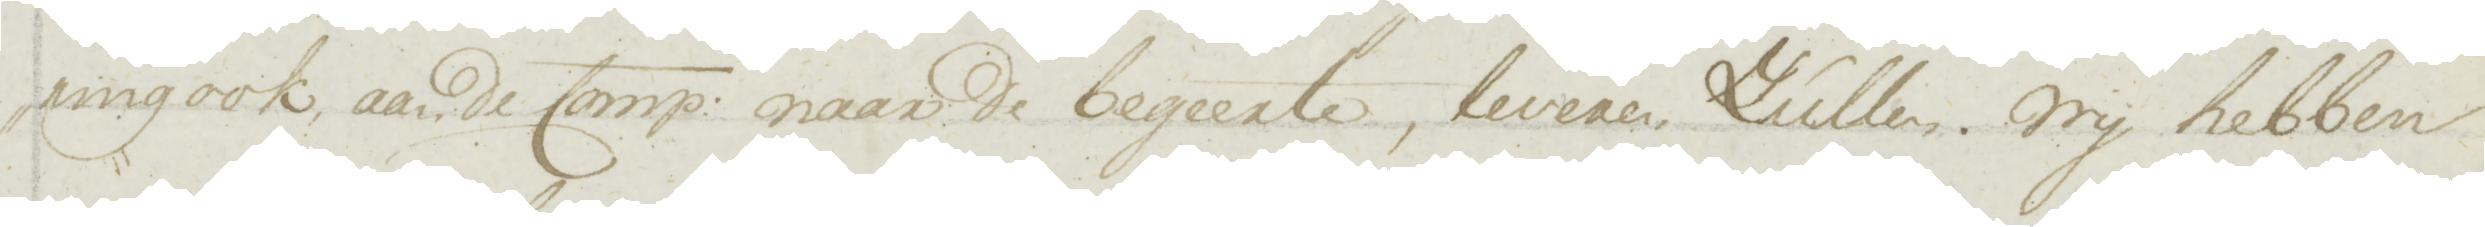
„ring ook, aan de Comp: naar de begeerte, leveren zullen. wij hebben
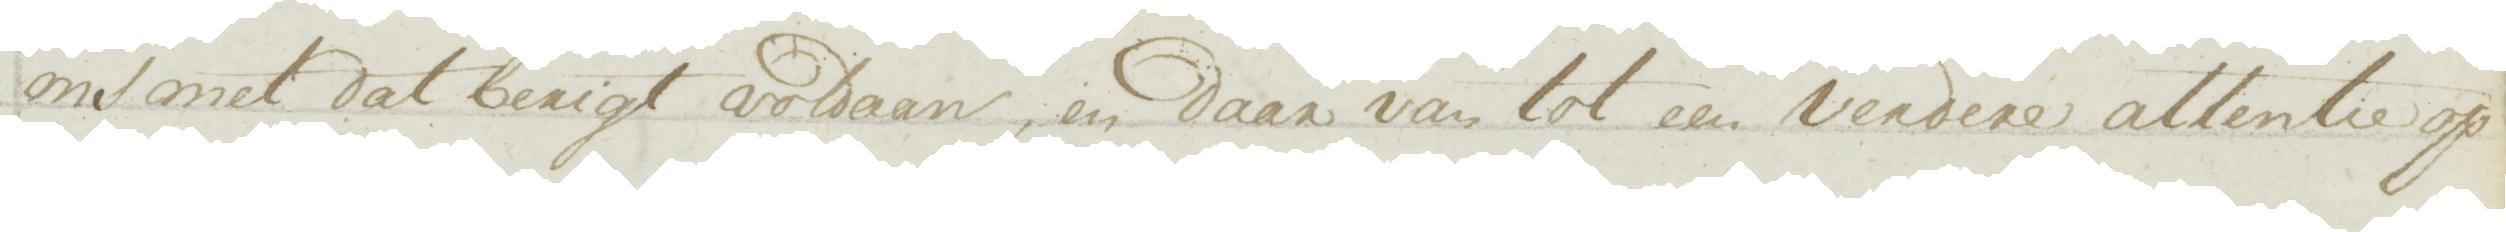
ons met dat berigt voldaan, en daar van tot een verdere attentie op
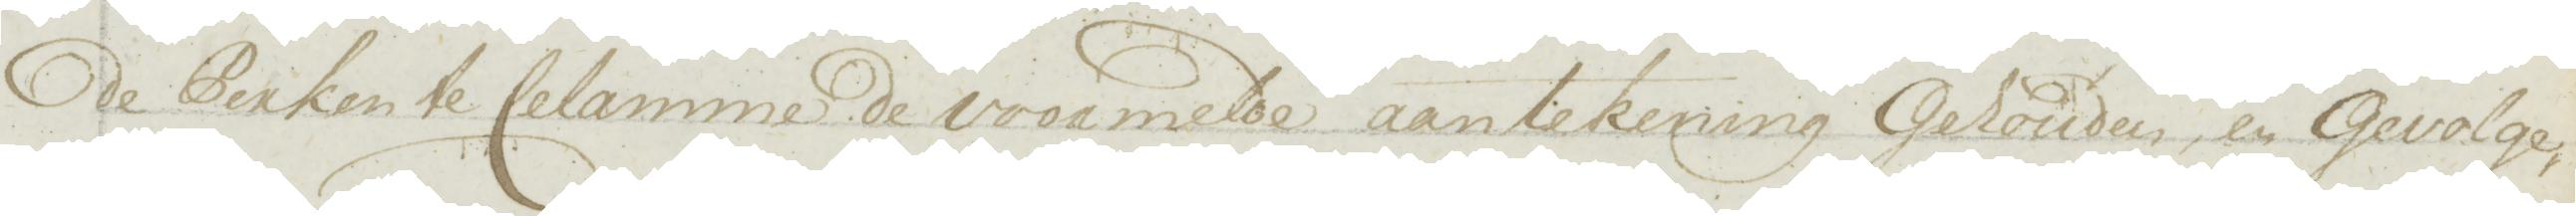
de Perken te celamme de voormelde aantekening gehouden, en Gevolge„
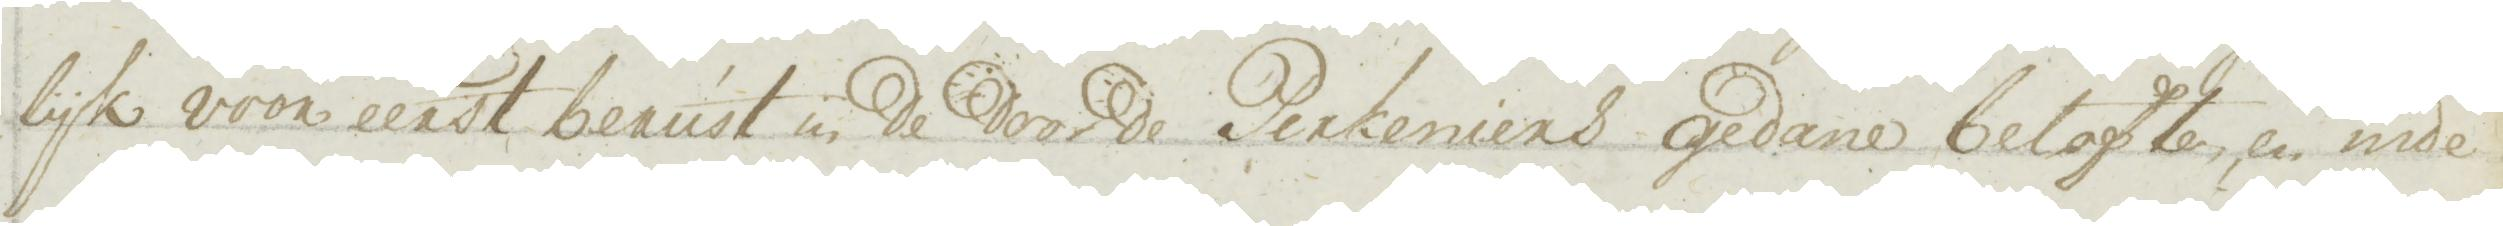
lijk voor eerst berust in de door de Perkeniers gedane beloften, en inde
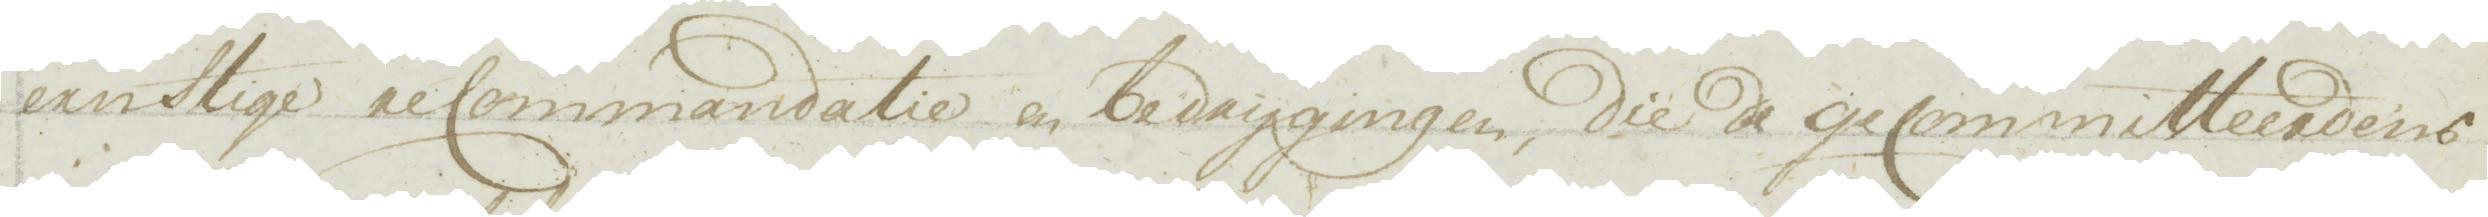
ernstige recommandatie en bedrijgingen, die de gecommitteerdens
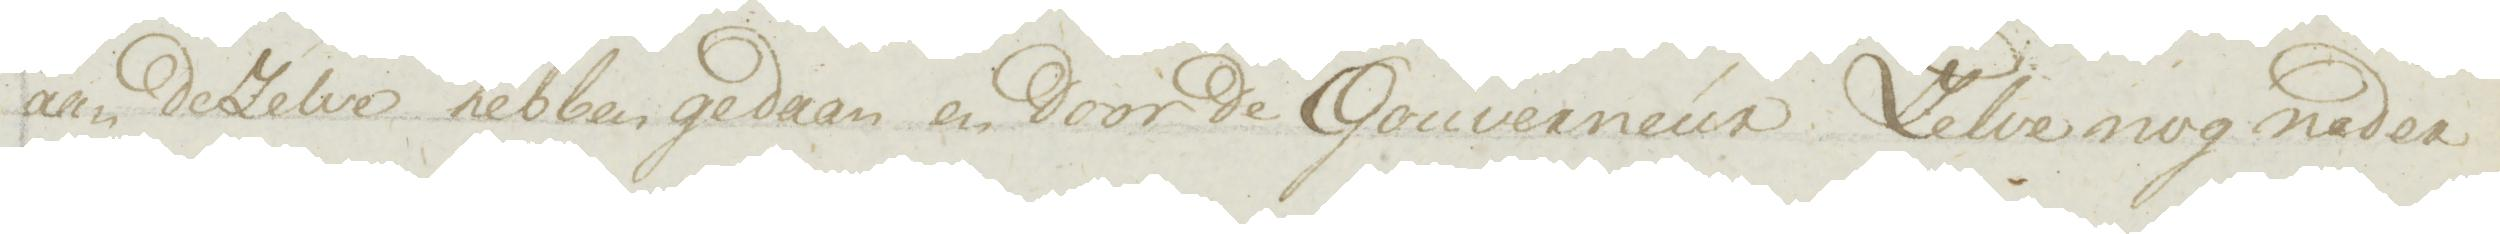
aan dezelve hebben gedaan en door de Gouverneur zelve nog nader
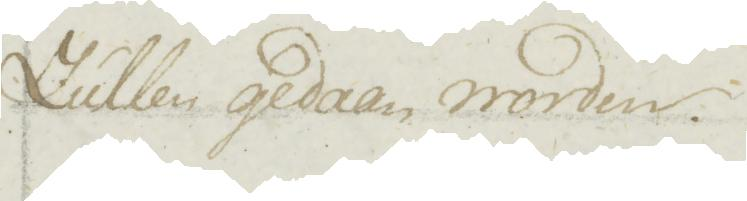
zullen gedaan worden.
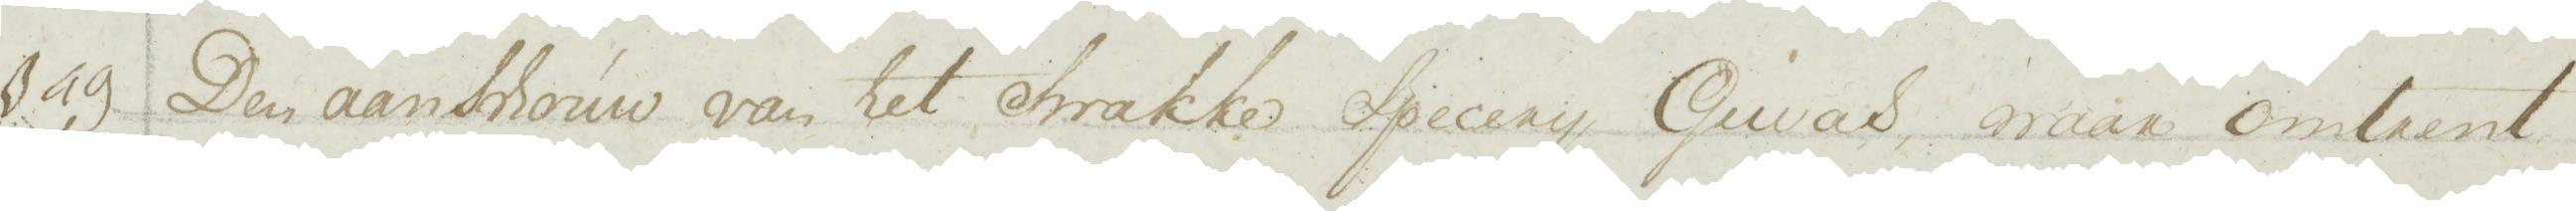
§ 49 Den aanschouw van het swakke Specerij Guvas, waar omtrent
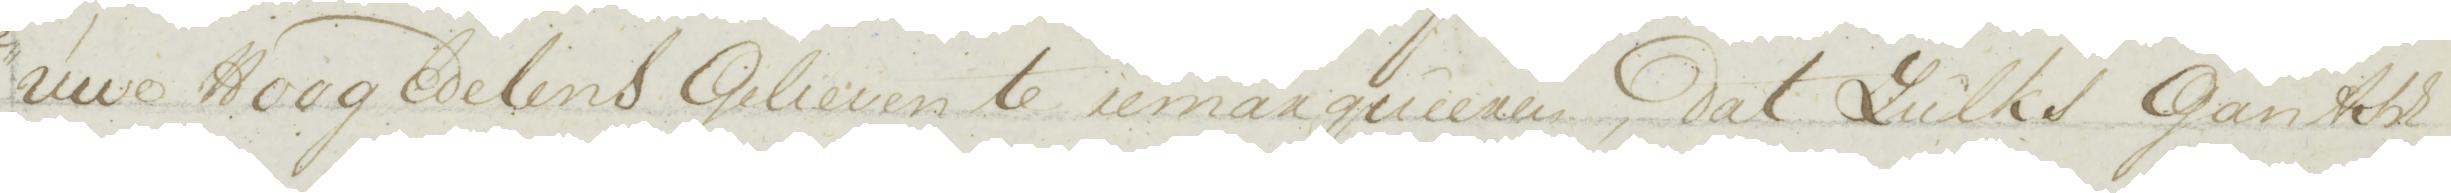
uwe Hoog Edelens Gelieven te remarqueeren, dat zulks Gantsch
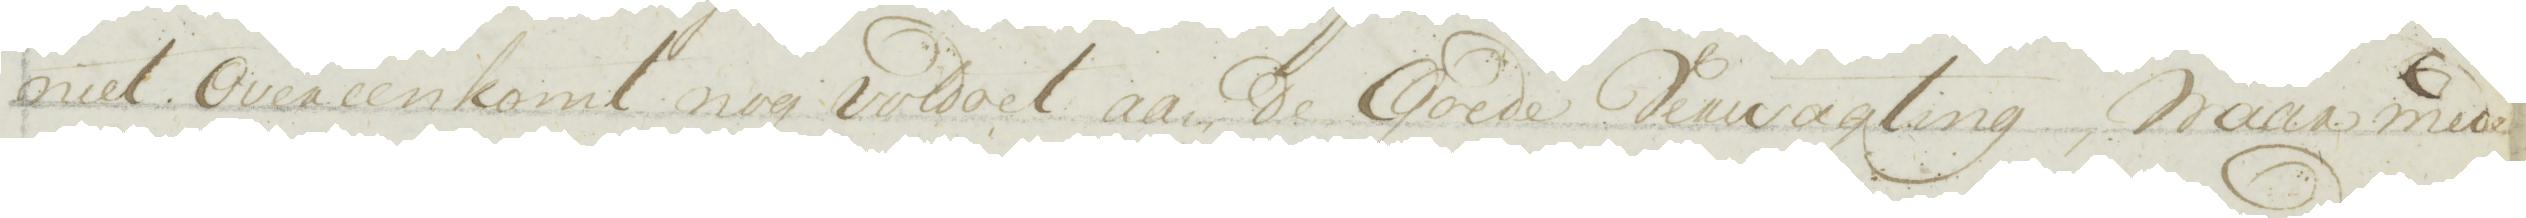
niet overeenkomt nog voldoet aan de Goede Verwagting, waar mede
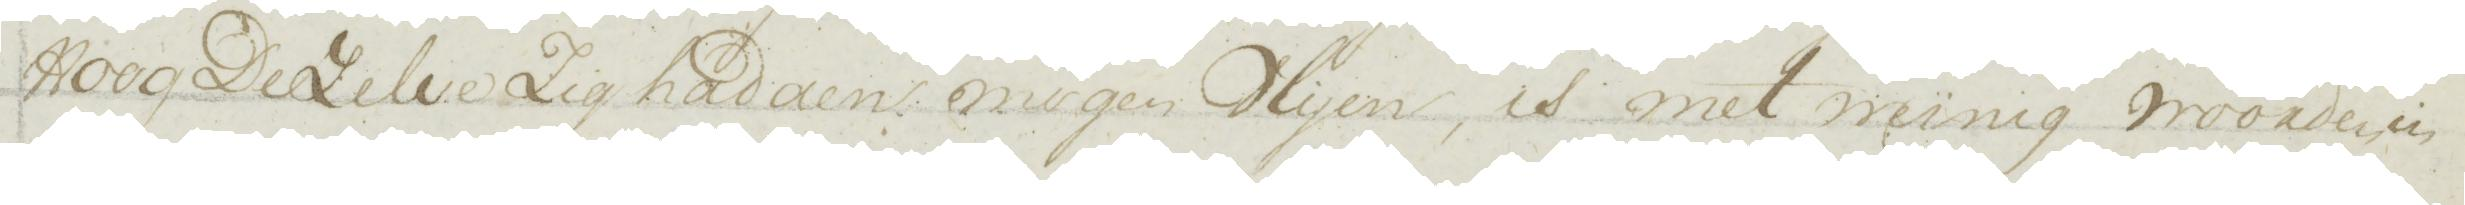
Hoog Dezelve zig hadden mogen vlijen, is met weinig woorden in
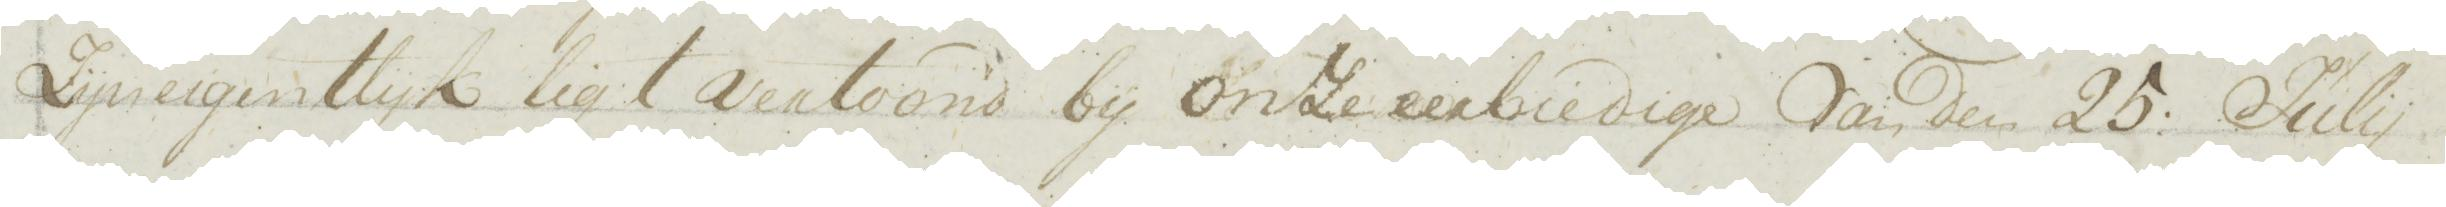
zijn eigentlijk ligt vertoond bij onze eerbiedige van den 25: Julij
